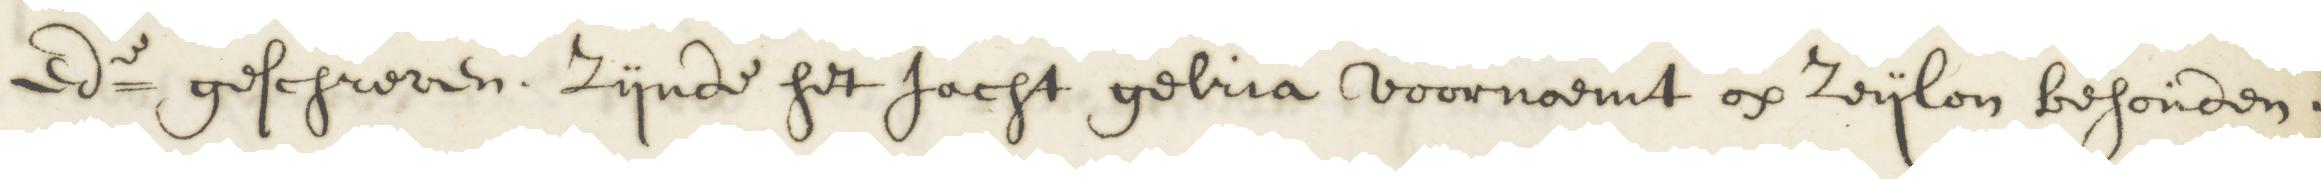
Ed=e geschreven. zijnde het jacht gelria voornoemt op zeijlon behouden.
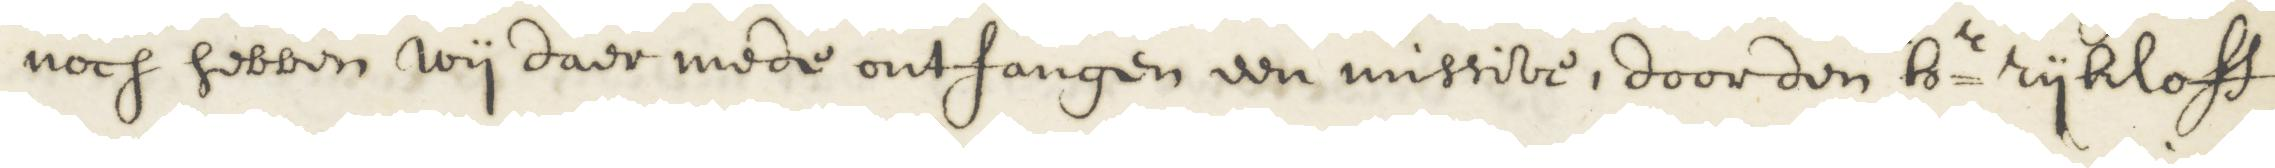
noch hebben wij daer mede ontfangen een missive, door den H=r rijkloff
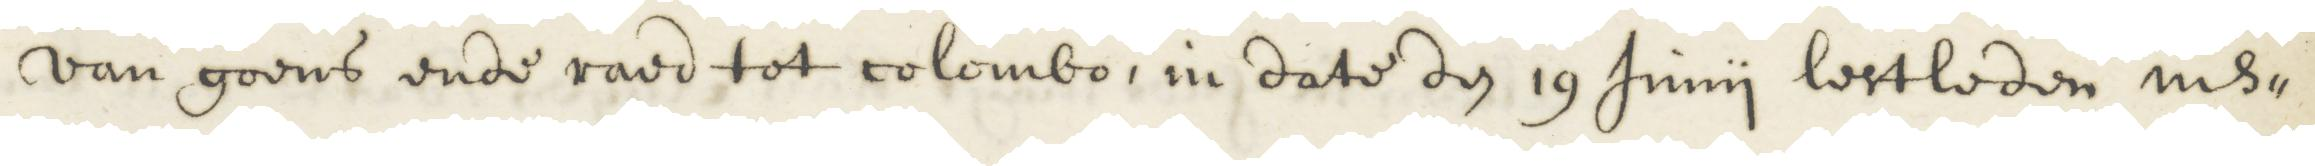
van goens ende raed tot colombo, in date den 19 Junij lestleden ins„
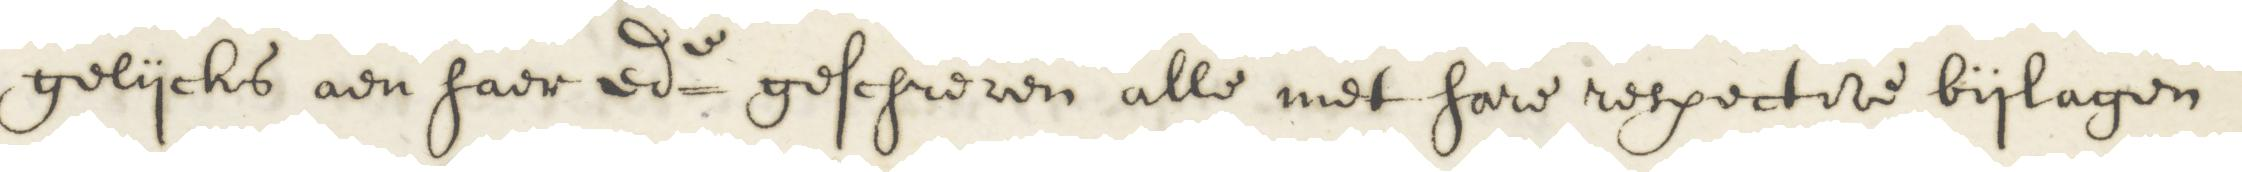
gelijcks aen haer Ed=e geschreven alle met hare respective bijlagen
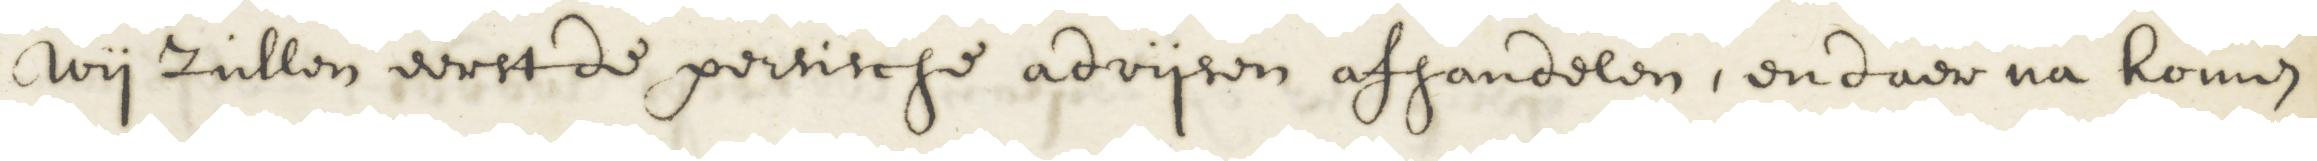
wij zullen eerst de persische advijsen afhandelen, en daer na komen
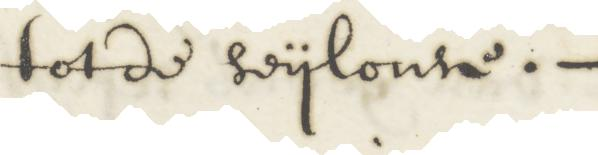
tot de seijlonse. —
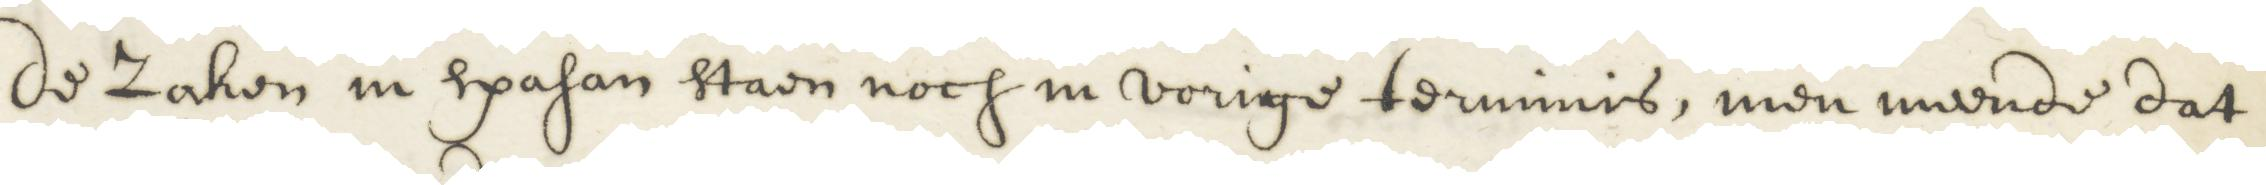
de zaken in spahan staen noch in vorige terminis, men meende dat
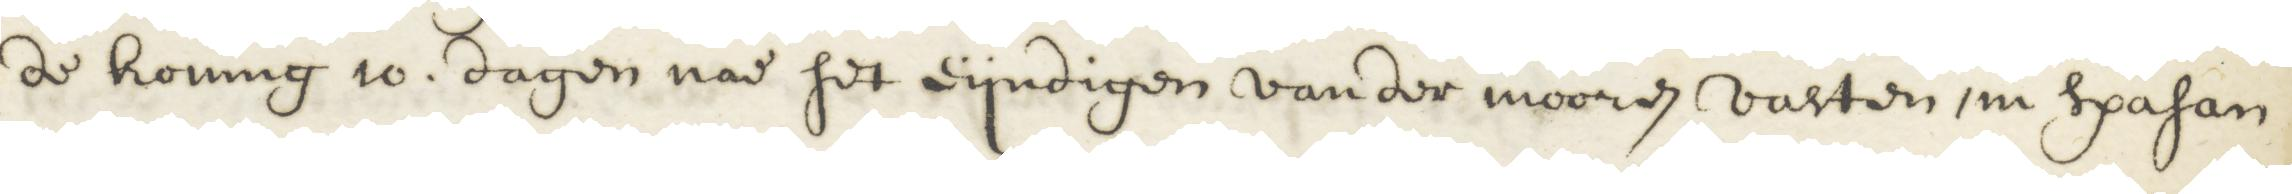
de koning 10. dagen nae het eijndigen van der mooren vasten, in spahan
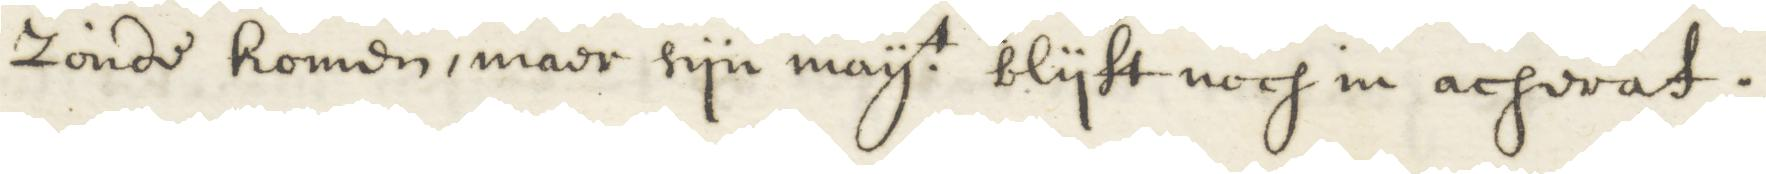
zoude komen, maer sijn maij.t blijft noch in acheraf.
